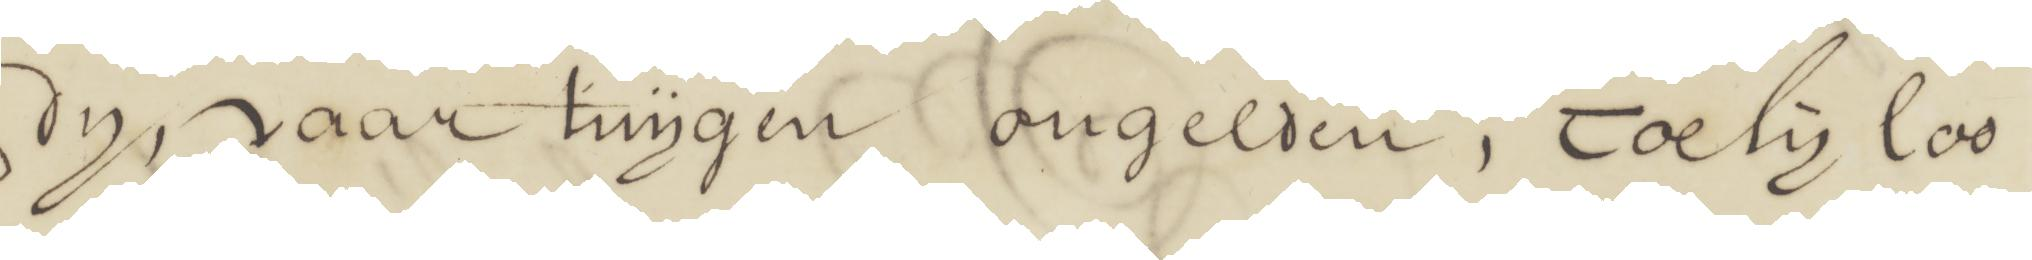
dy, vaar tuijgen ongelden, coelij loo
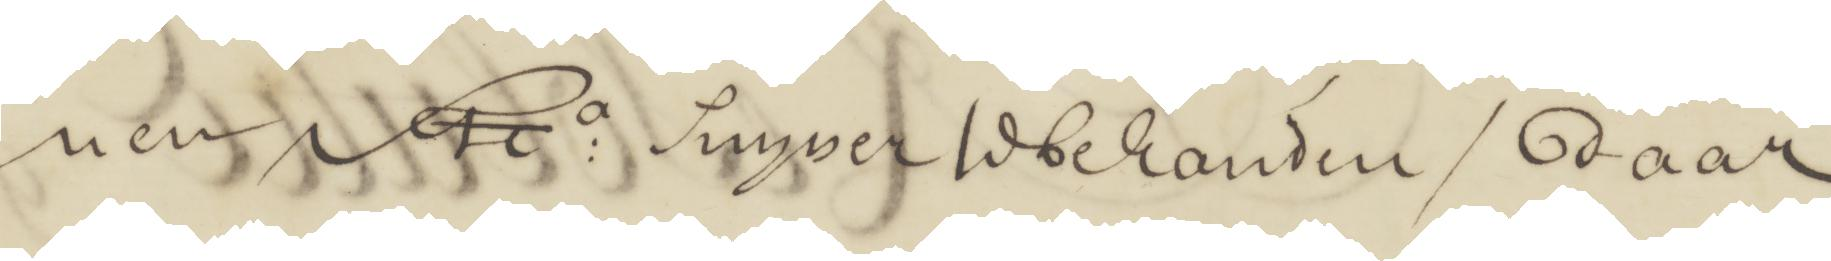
nen Etc:a suyver tebehouden / daar
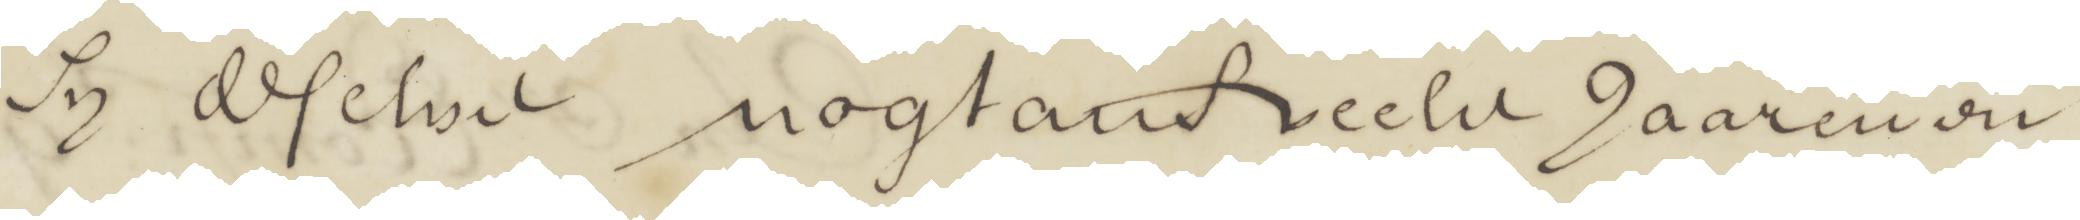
sy deselve nogtans veele jaaren en
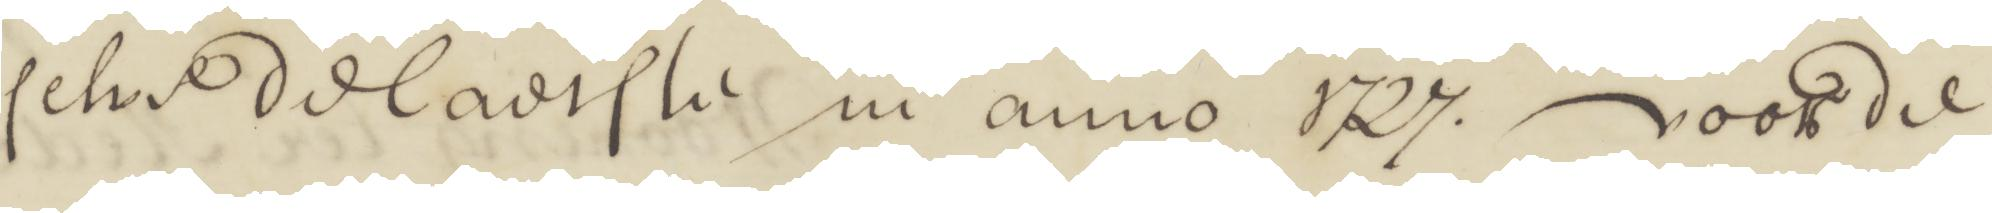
selve de laetste in anno 1727. voor de
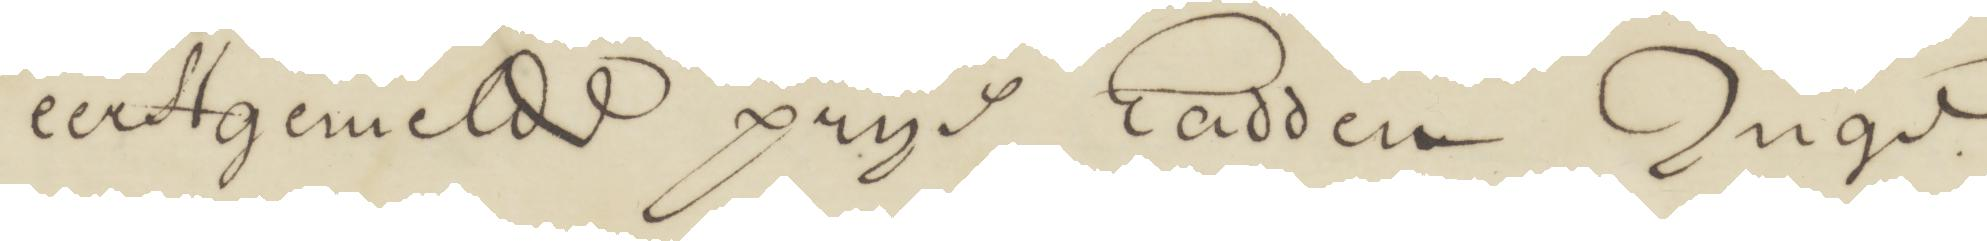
eerstgemelde prijs hadden Inge.
